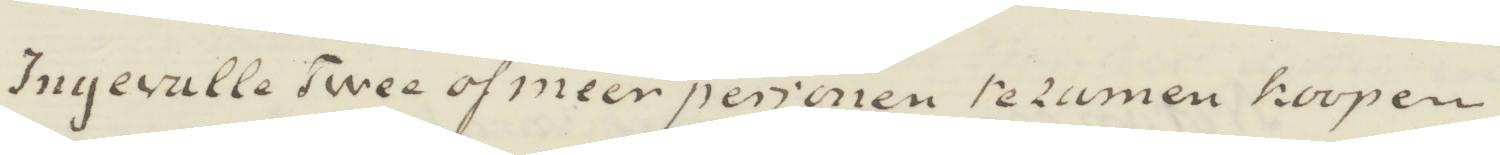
Ingevalle Twee of meer personen te zamen koopen
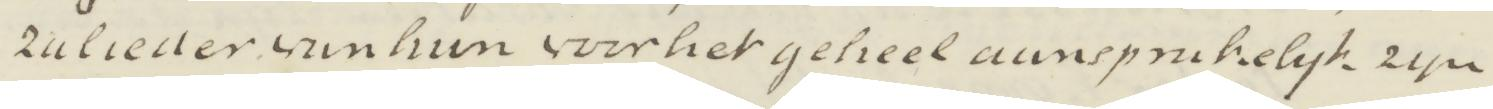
zal ieder van hun voor het geheel aansprakelyk zyn
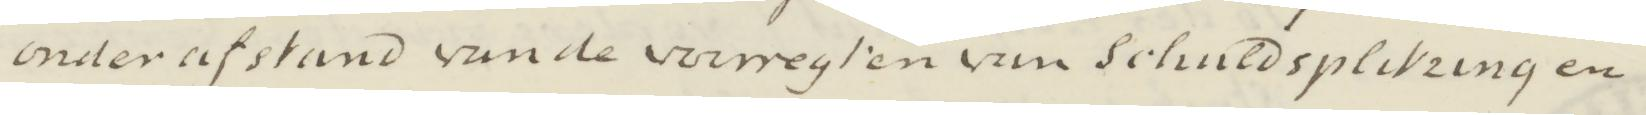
onder afstand van de voorregten van schuldsplitzing en
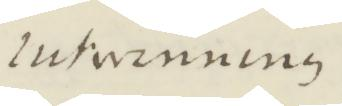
uitwinning
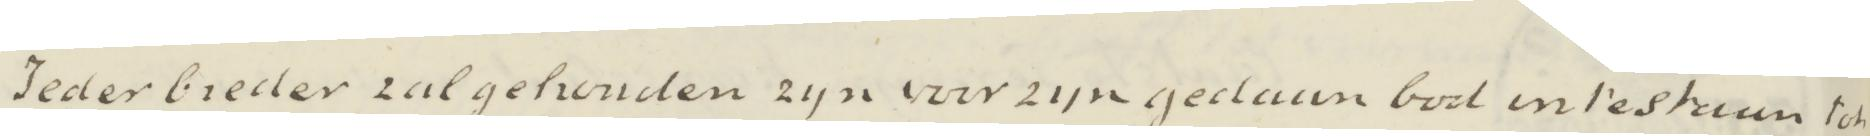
Ieder bieder zal gehouden zyn voor zyn gedaan bod in te staan tot
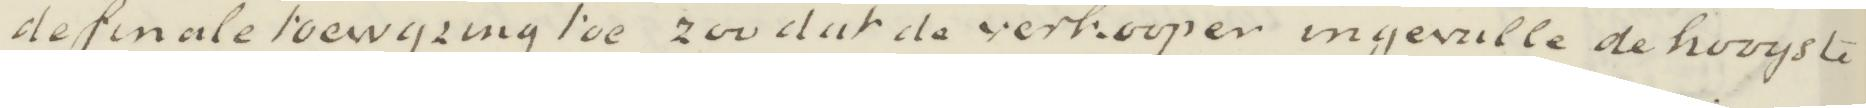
de finale toewyzing toe zoo dat de verkooper ingevalle de hoogste
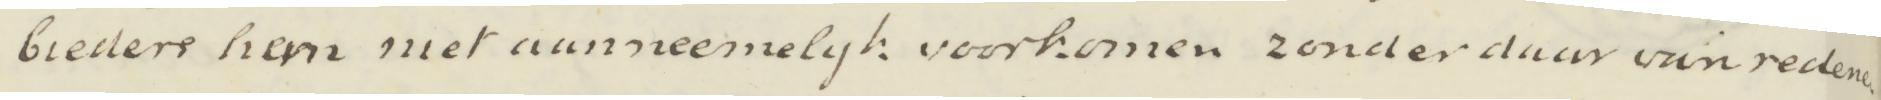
bieders hem niet aanneemelyk voorkomen zonder daar van redenen
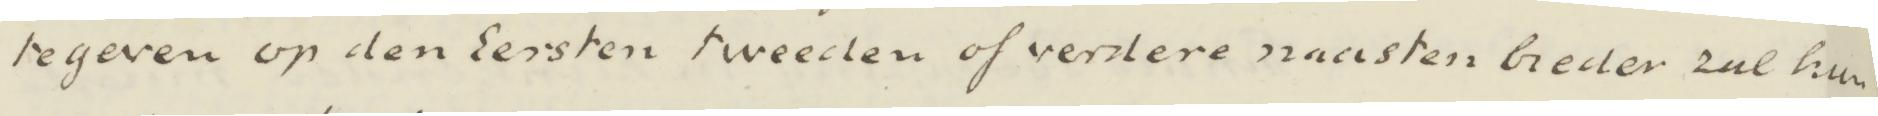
te geven op den Eersten tweeden of verdere naasten bieder zal kun
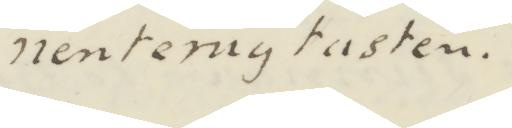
nen terug tasten.
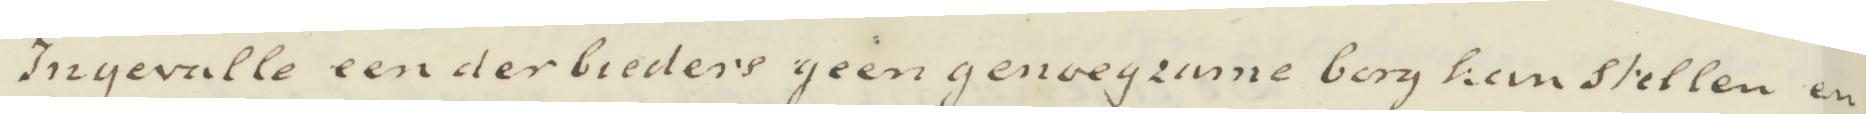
Ingevalle een der bieders geen genoegzame borg kan stellen en
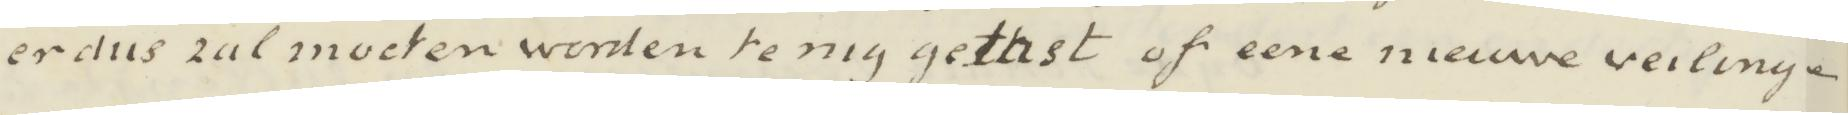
er dus zal moeten worden terug getast of eene nieuwe veilinge
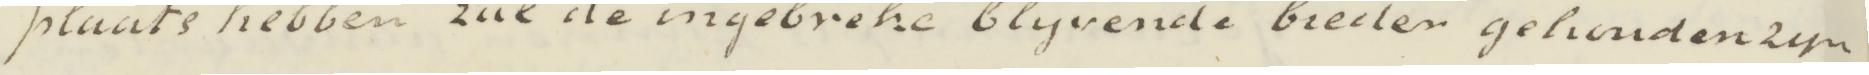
plaats hebben zal de ingebreke blyvende bieder gehouden zyn
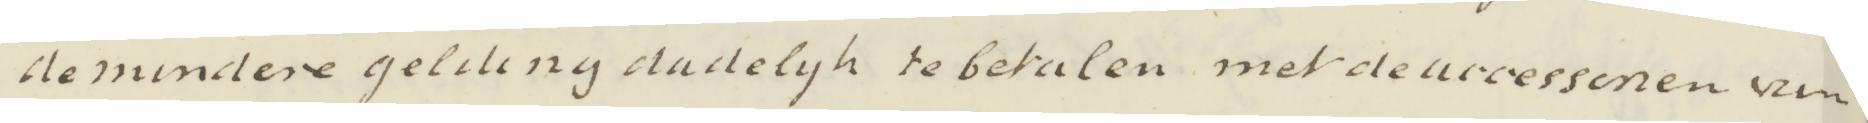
de mindere gelding dadelyk te betalen met de accessoren van
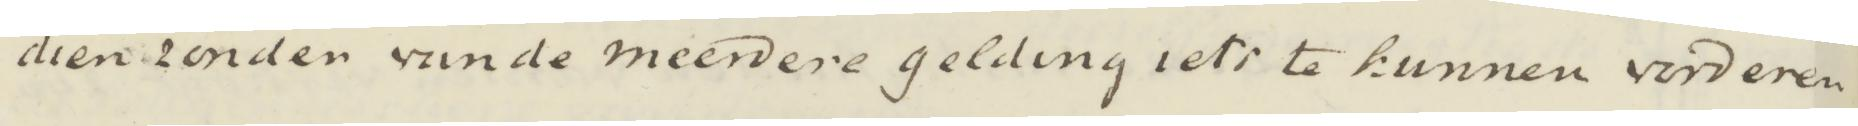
dien zonder van de meerdere gelding iets te kunnen vorderen
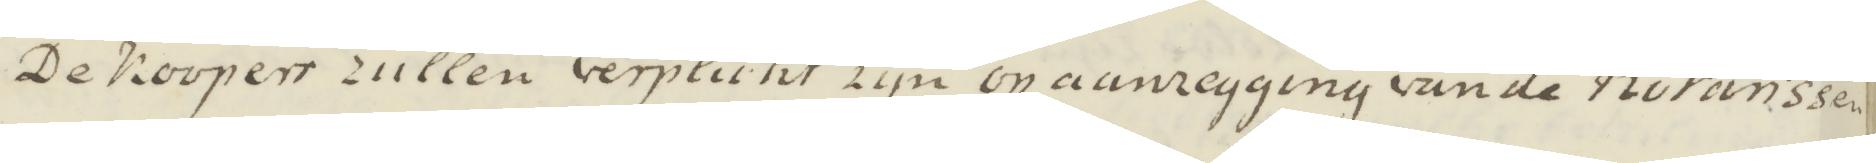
De koopers zullen verplicht zyn op aanzegging van de Notarissen
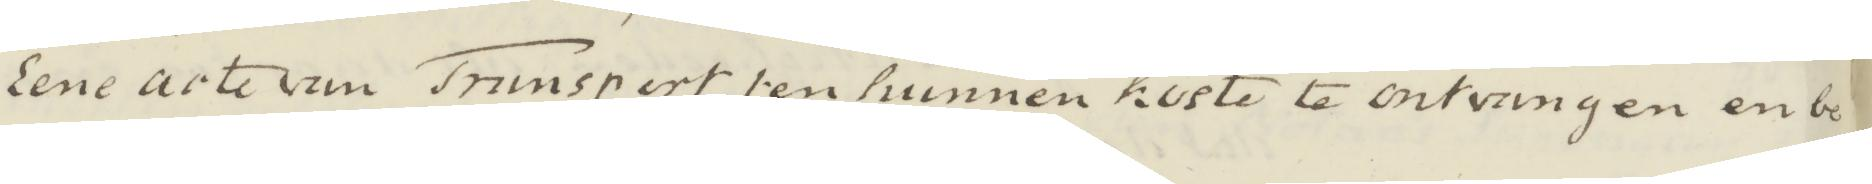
Eene acte van Transport ten hunnen koste te ontvangen en be
